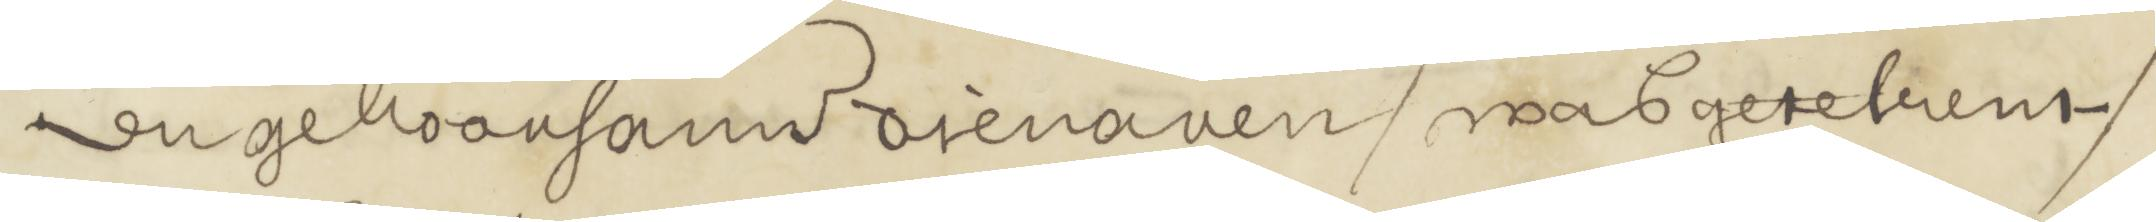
en gehoorsame dienaren / was getekent/
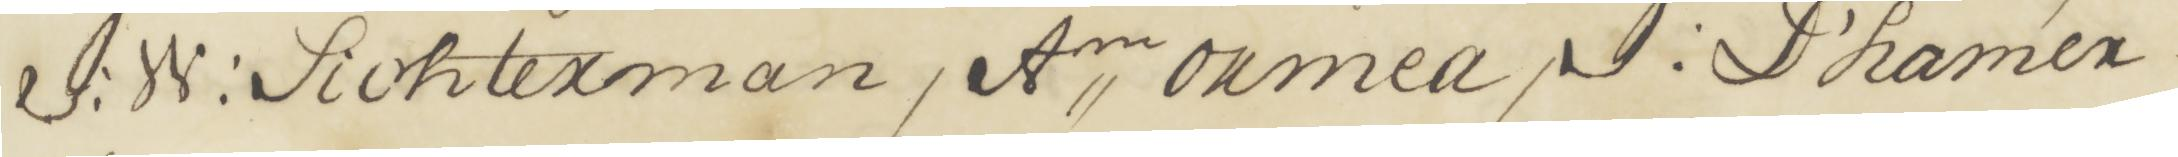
I: W: Sichterman, A„m ormea, I: D'hamer
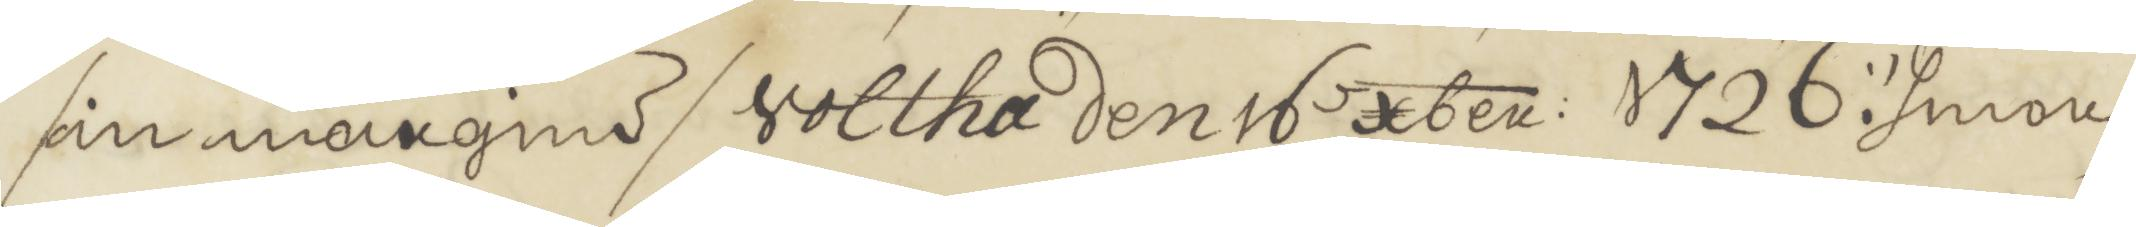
/in margine/ voltha den 16„e xber: 1726: 'smor
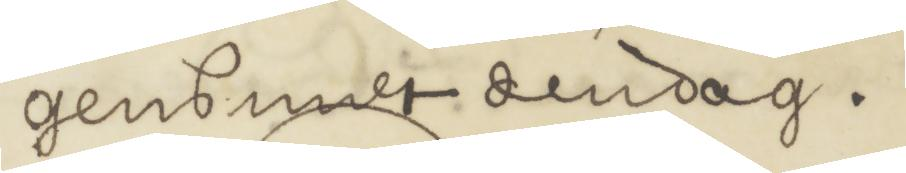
gens met den dag.
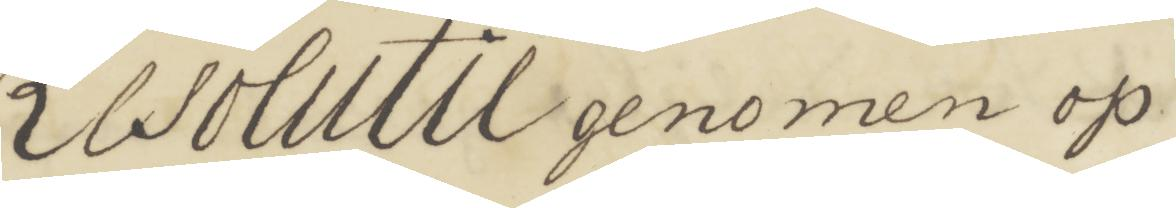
Resolutie genomen op
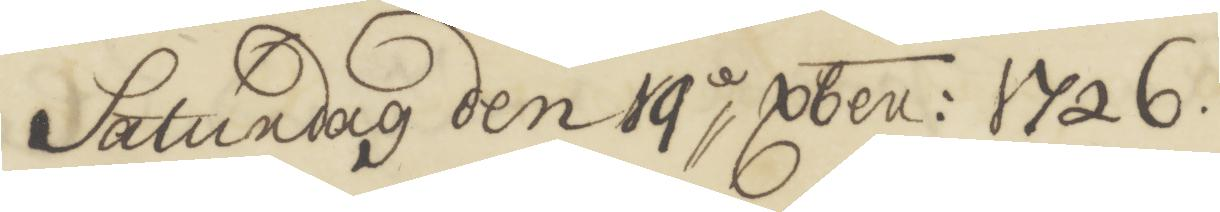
Saturdag den 14„e xber: 1726:
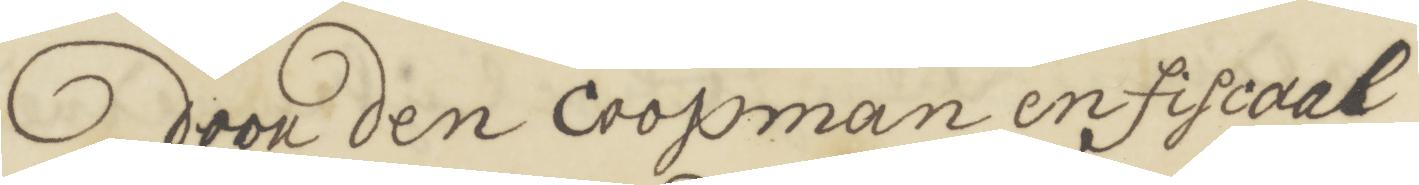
door den coopman en fiscaal
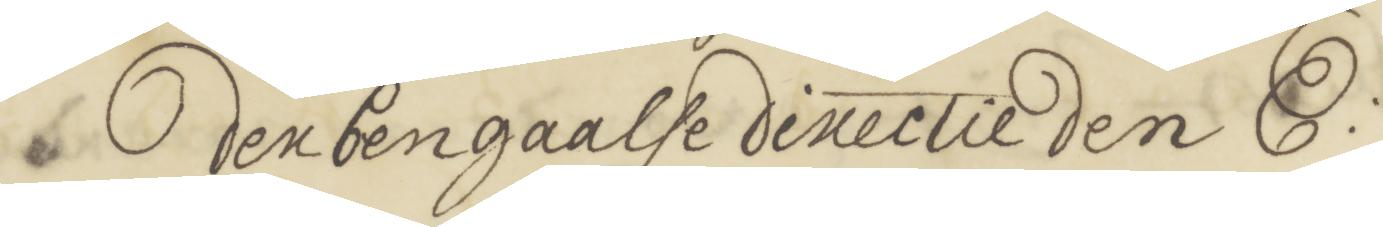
der bengaalse directie den E:
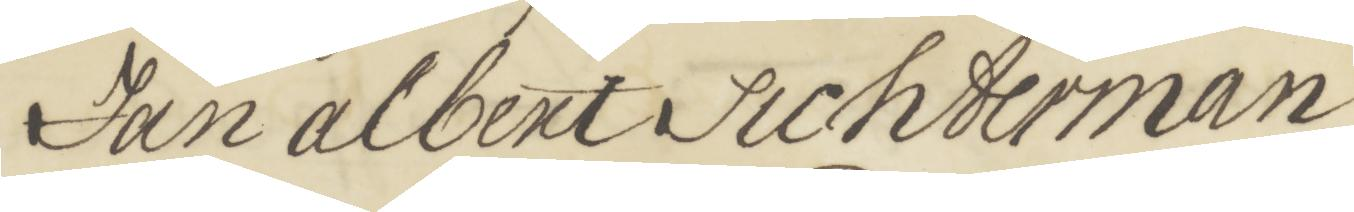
Ian albert Sichterman
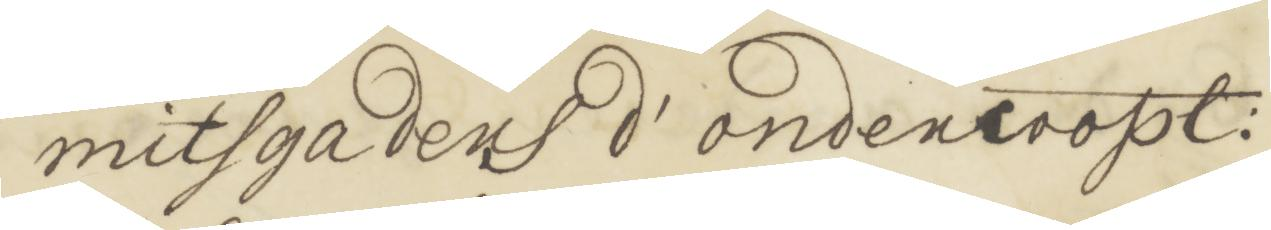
mitsgaders d’ ondercoopl:
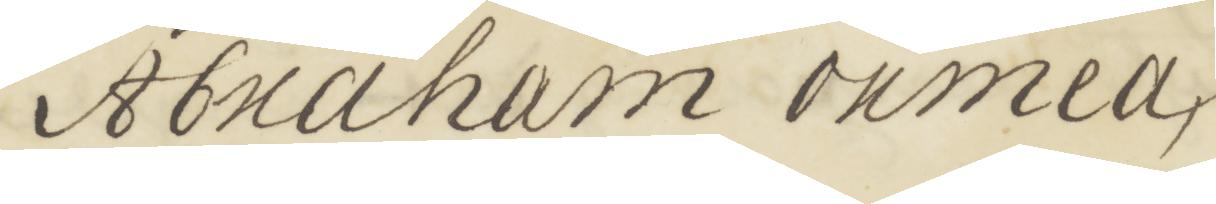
Abraham ormea,
